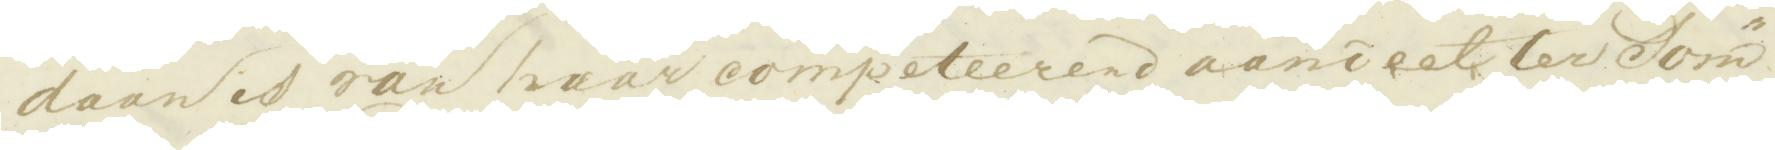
daan is van haar competeerend aandeel ter som
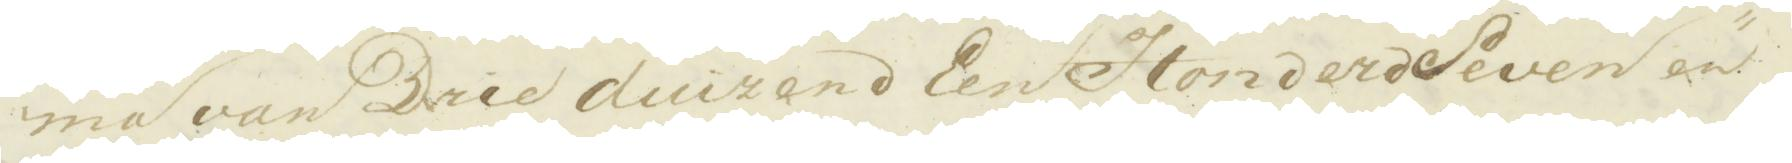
ma van Drie duizend Een Honderd Seven en
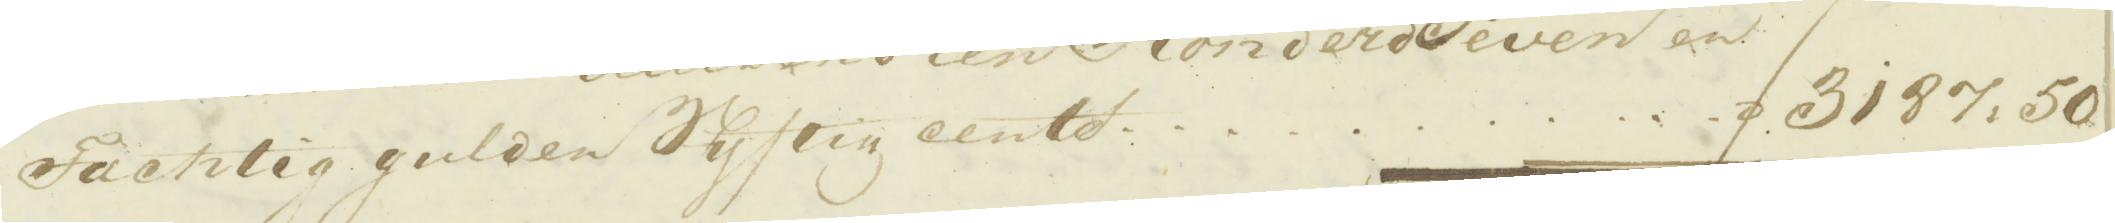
Tachtig gulden Vyftig cents. . . . . . . . . . . ƒ.3187.50
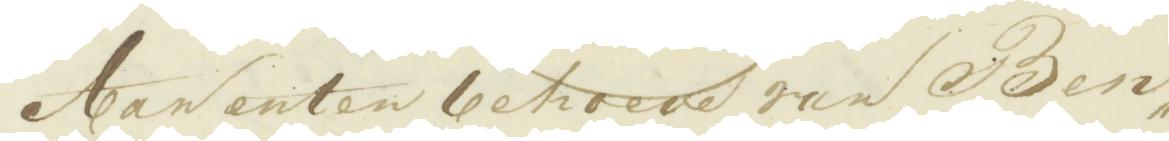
Aan en ten behoeve van Ben
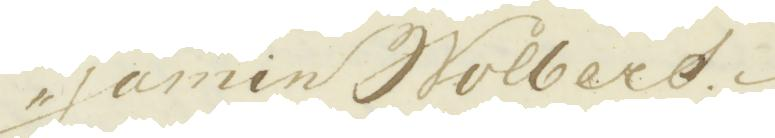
„jamin Wolbers.—
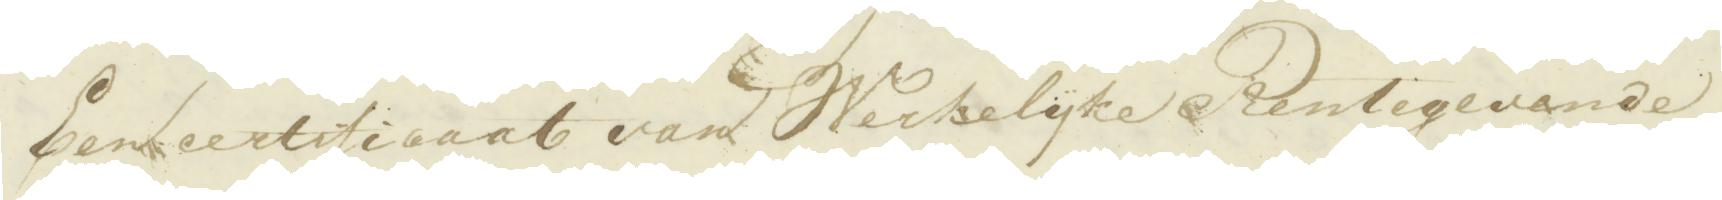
Een certificaat van Werkelijke Rentegevende
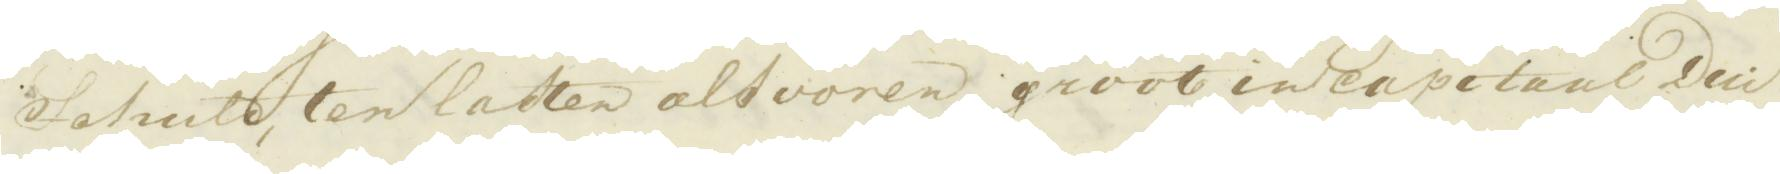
schuld, ten lasten als voren, groot in capitaal Dui
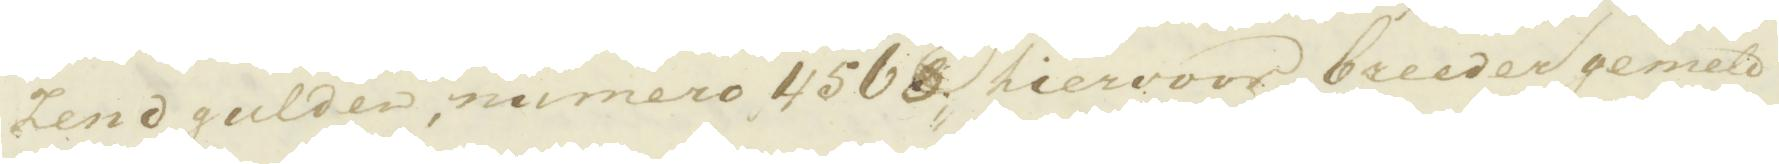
zend gulden, numero 4568. hiervoor breeder gemeld
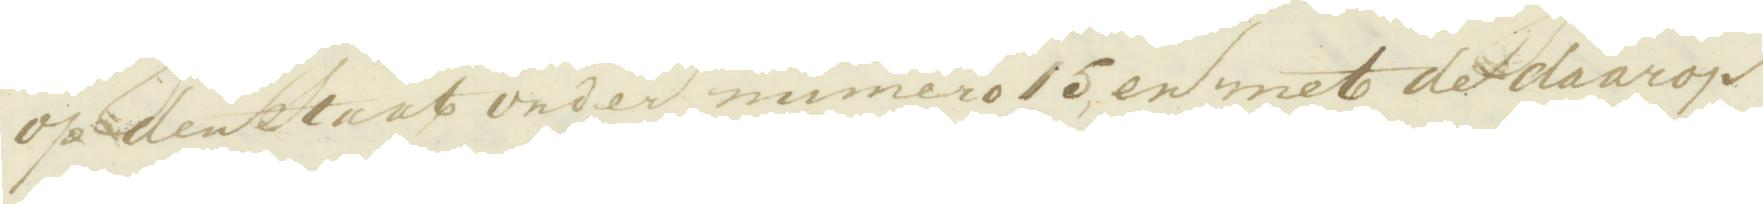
op den staat onder numero 15, en met de daarop
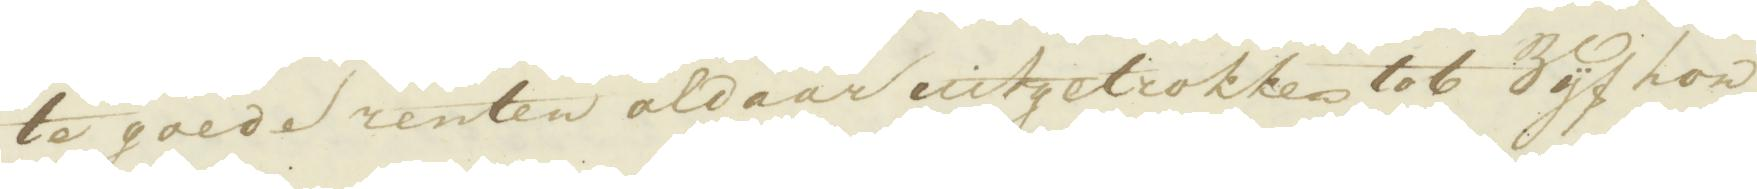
te goede renten aldaar uitgetrokken tot Vijf hon
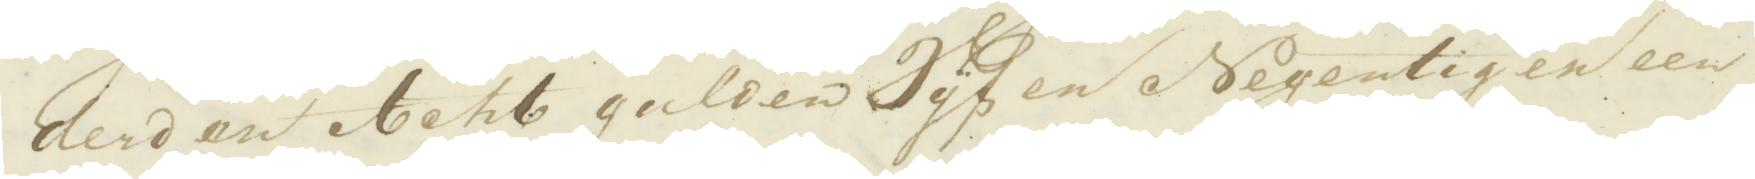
derd en Acht gulden Vijf en Negentig en een
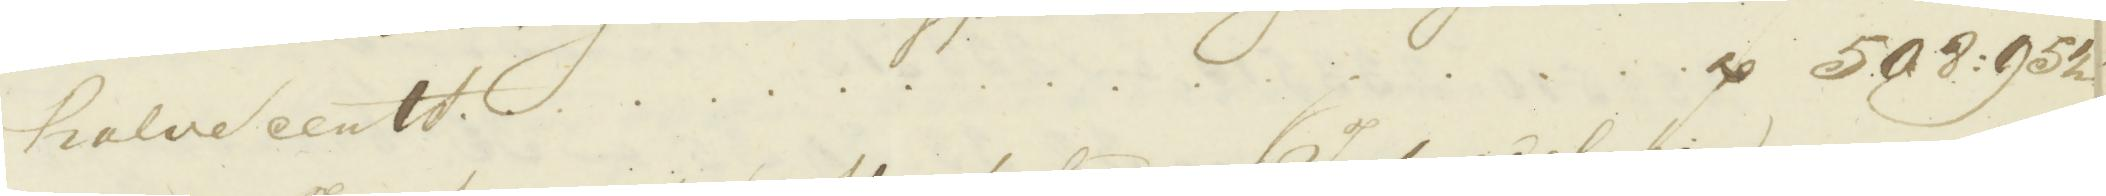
halve cents. . . . . . . . . . . . . . . . . . ƒ508:95½
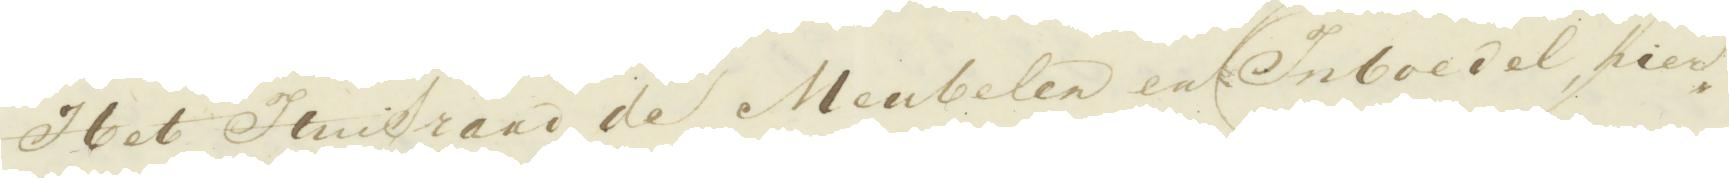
Het Huisraad de Meubelen en Inboedel, hier„
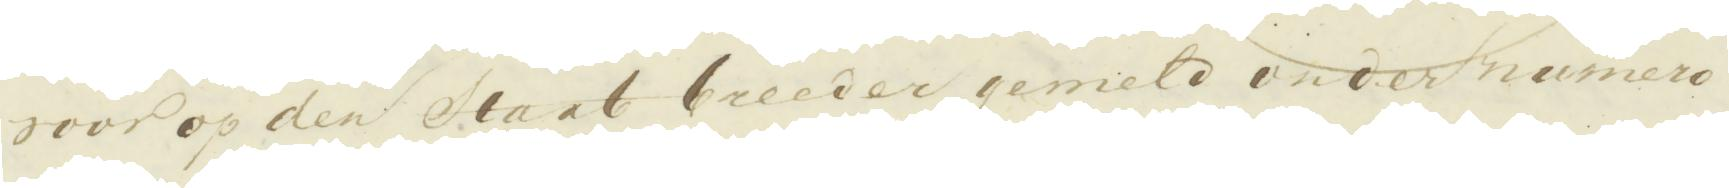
voor op den staat breeder gemeld onder numero
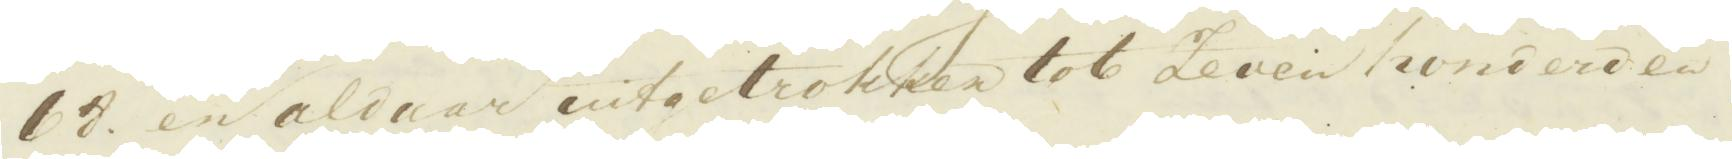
68. en aldaar uitgetrokken tot Zeven honderd en
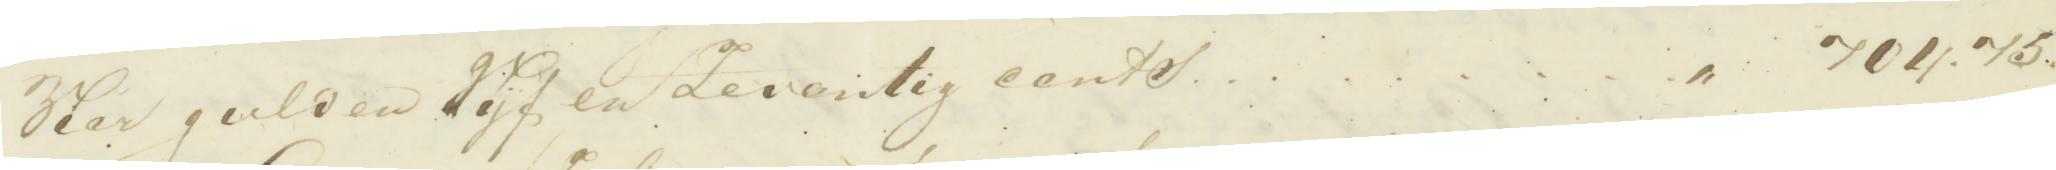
Vier gulden Vijf en Zeventig cents. . . . . . . . . „ 704:75.
